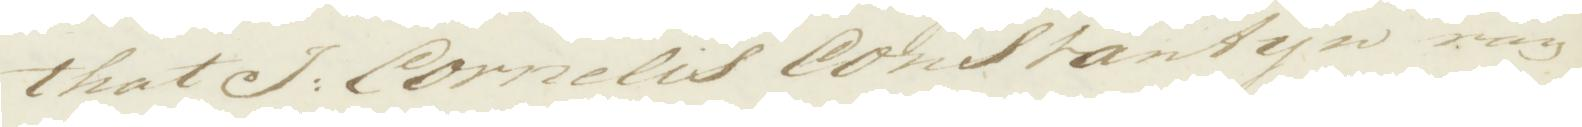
that J: Cornelis Constantijn van
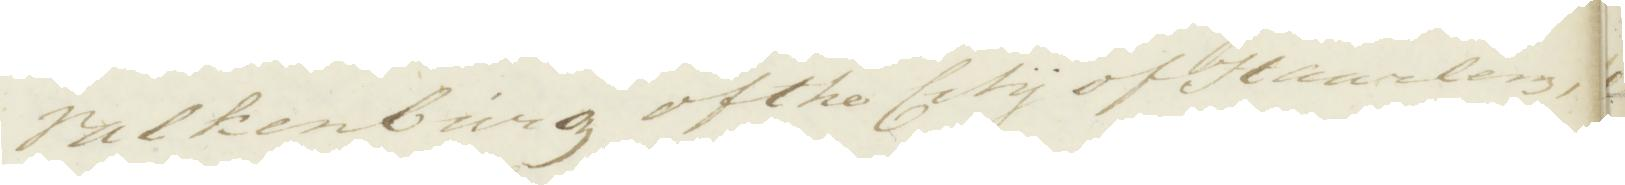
Valkenburg of the City of Haarlem,
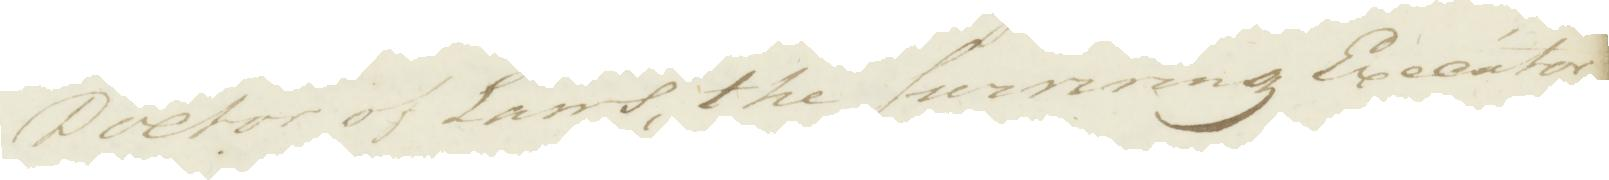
Doctor of Laws, the serving Executor
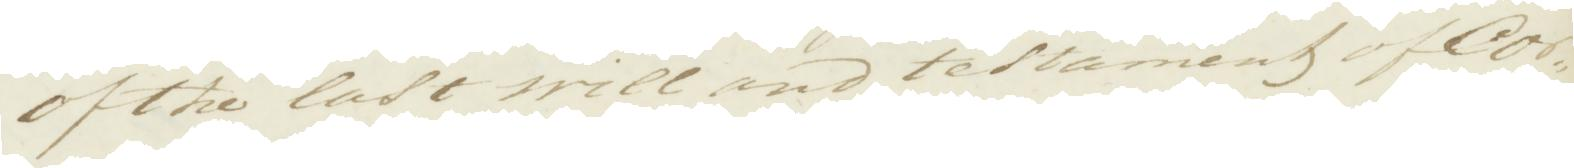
of the last will and testament of Cor„
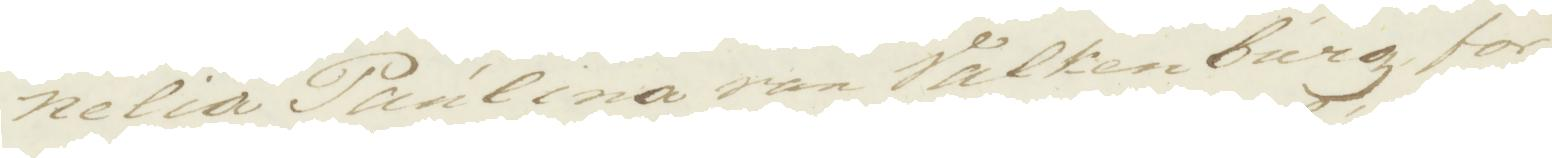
nelia Paulina van Valkenburg for
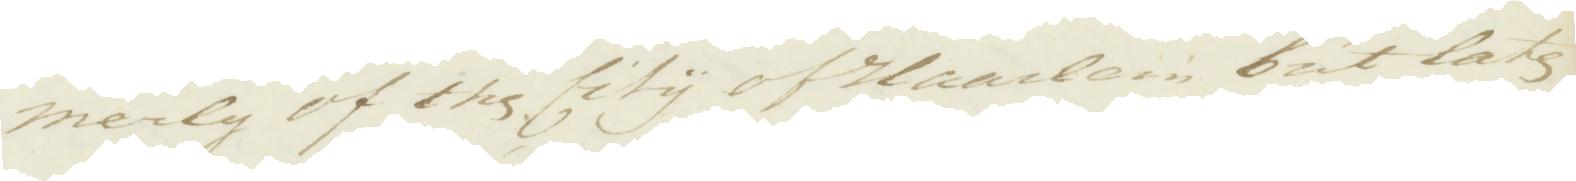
merly of the Citij of Haarlem but late
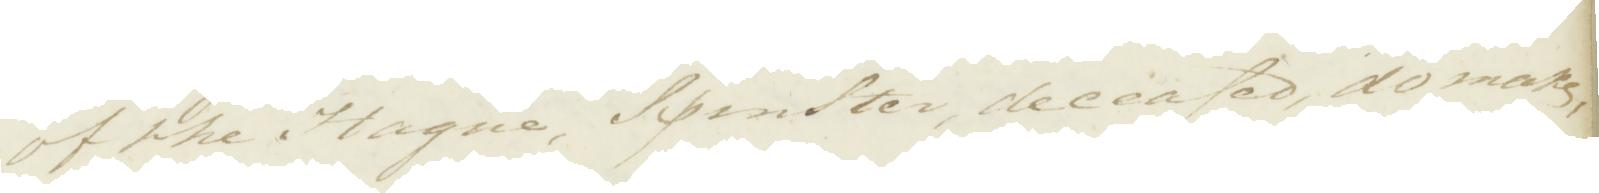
of the Hague, Spinster, deceased, do make,
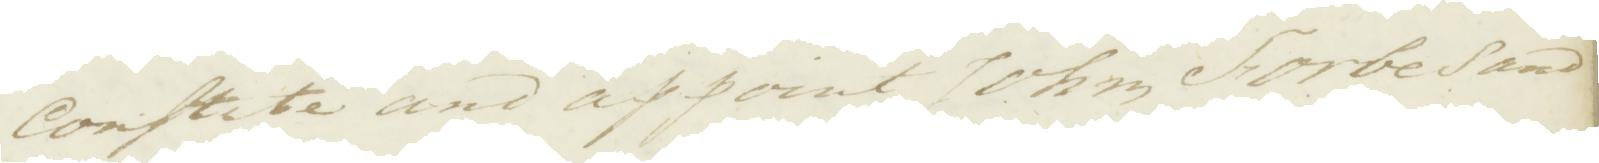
Constite and appoint John Forbes and
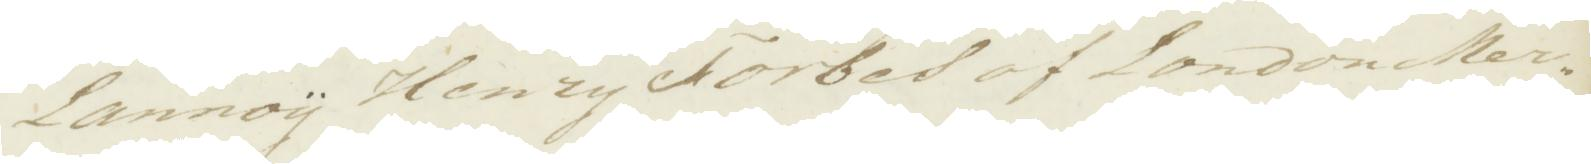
Lannoij Henry Forbes of London Mer„
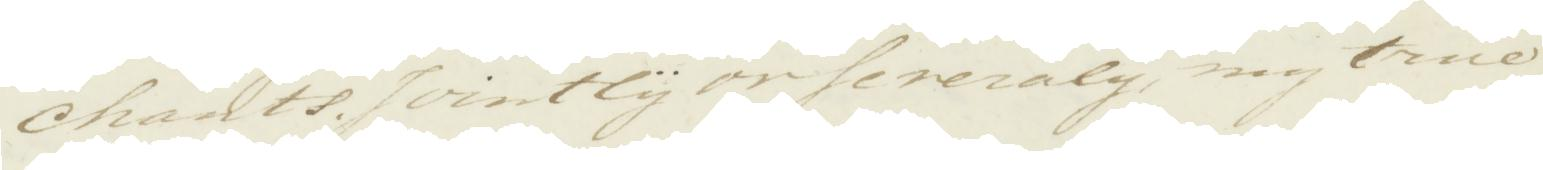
chants, Jointlij or severaly, my true
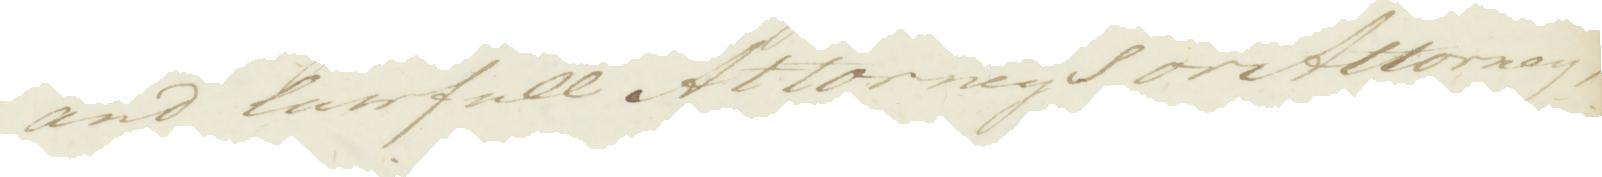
and lawfull Attorneys or Attorney,
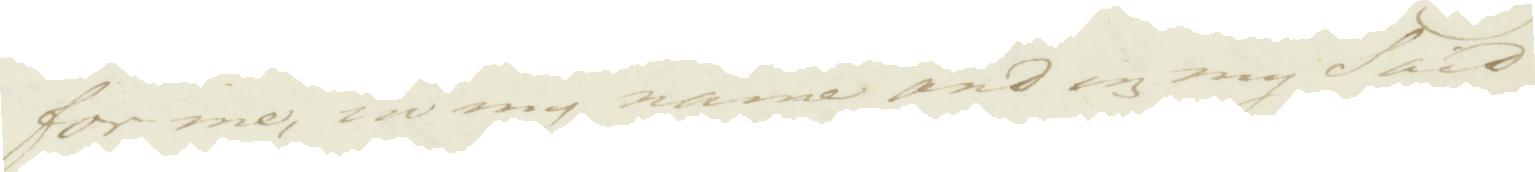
for me, in my name and as my Said
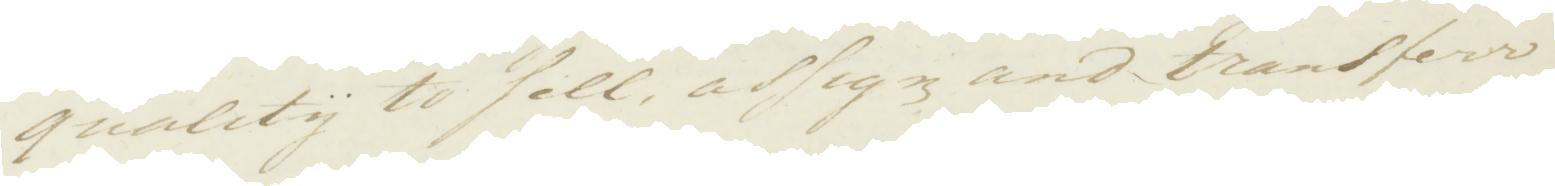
qualitij to sell, assign and transferr
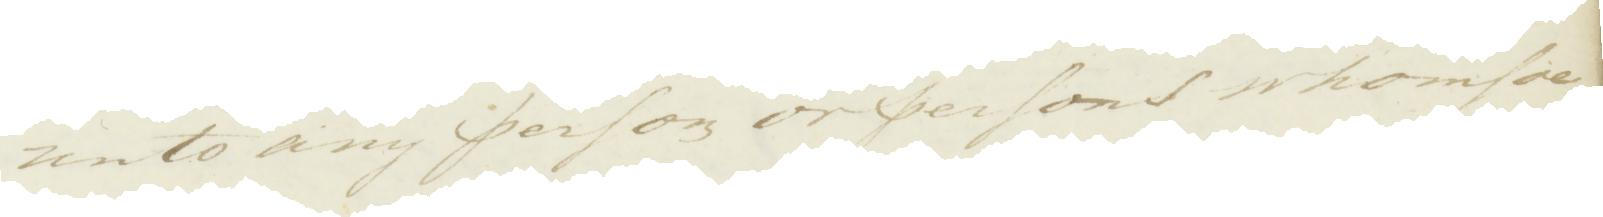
unto any person or persons whomsoe
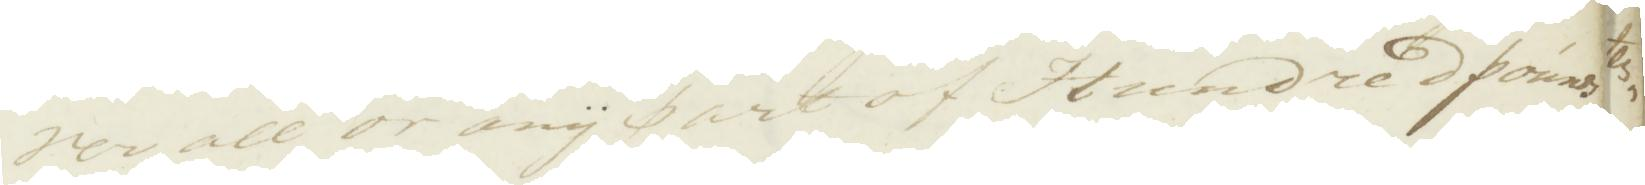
ver all or anij part of Hundred Pounds
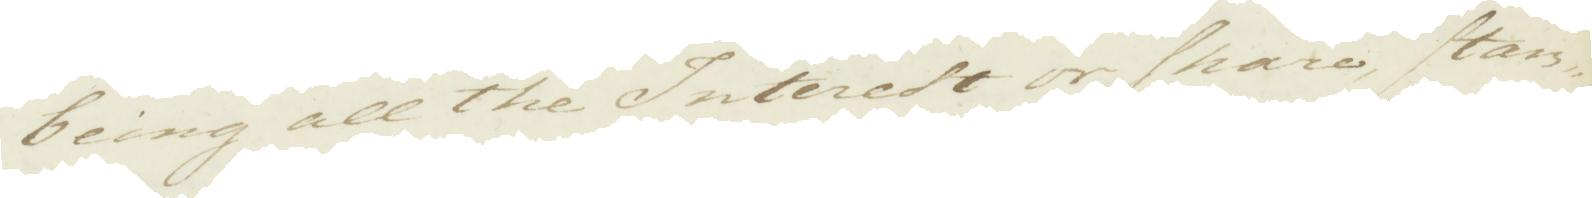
being all the Interest or share stan„
